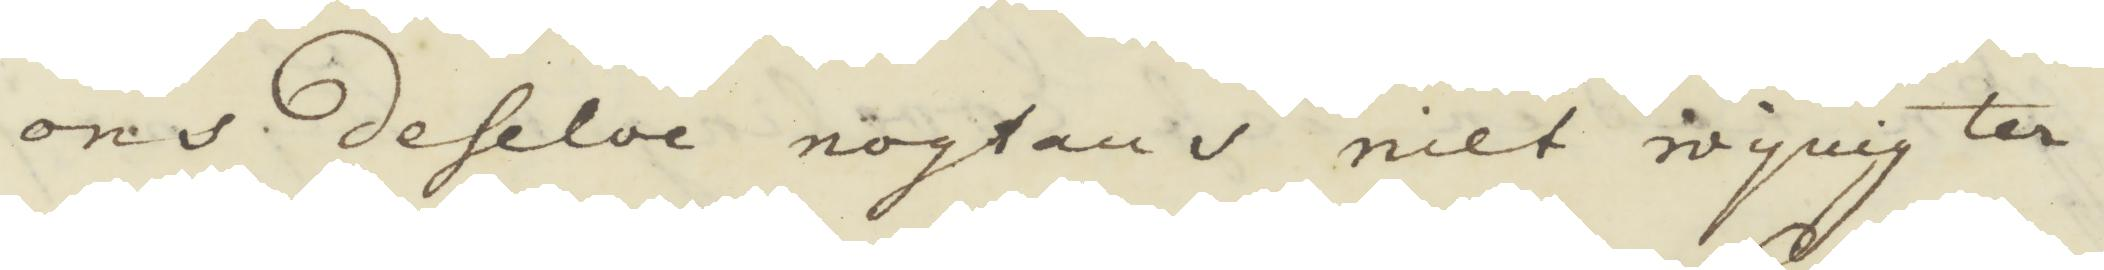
ons deselve nogtans niet wijnig ter
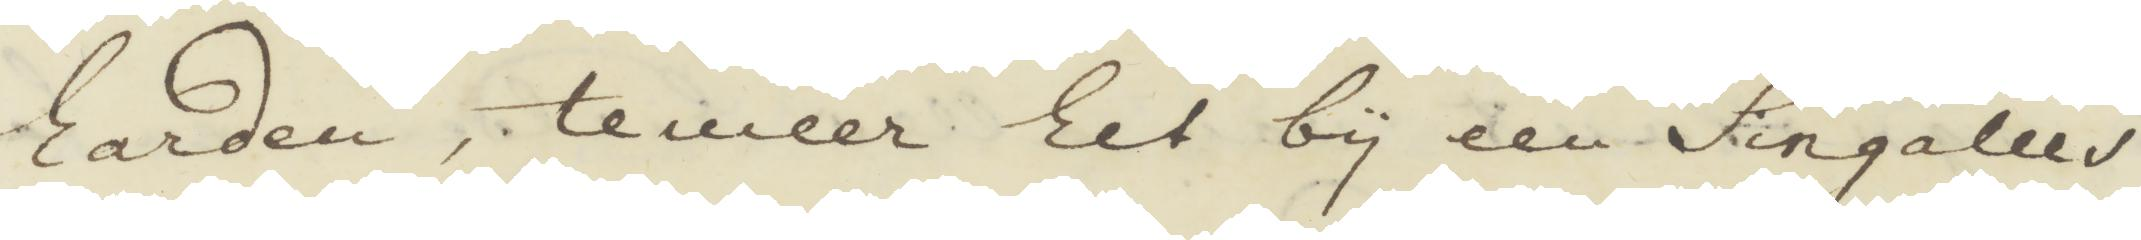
harden, te meer het bij een singalees
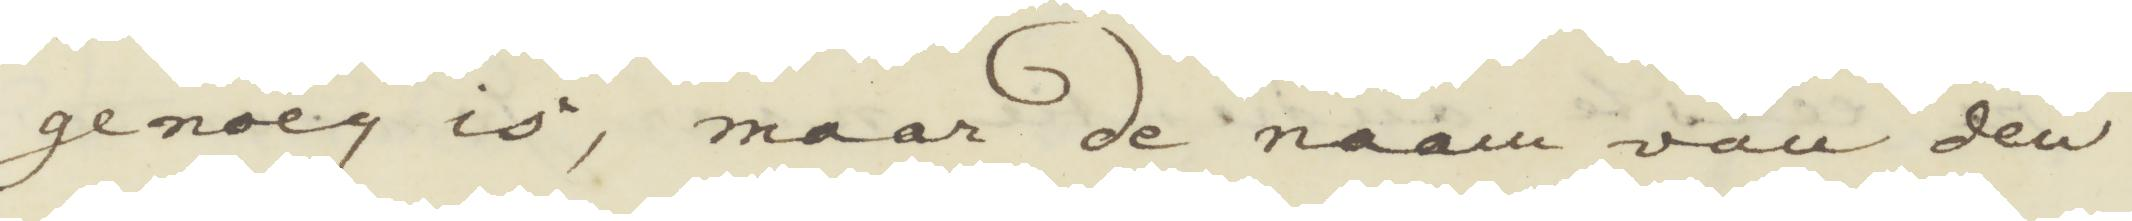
genoeg is, maar de naam van den
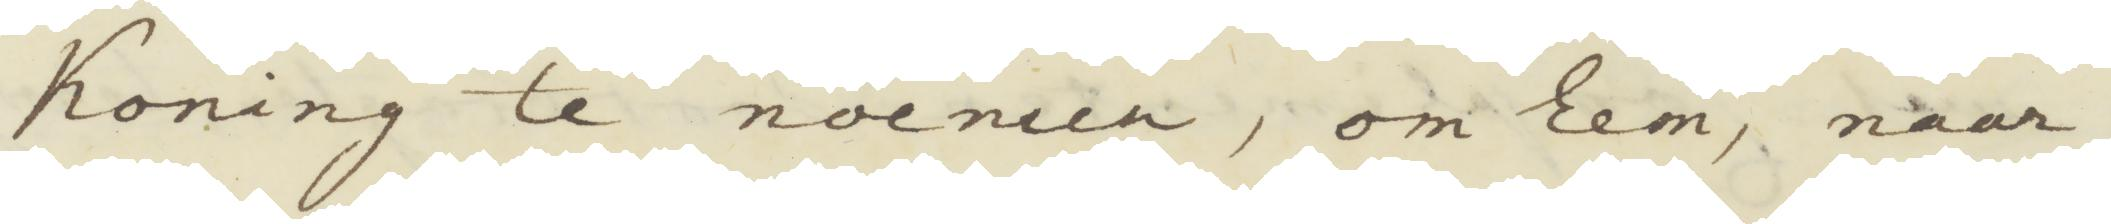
Koning te noemen, om hem, naar
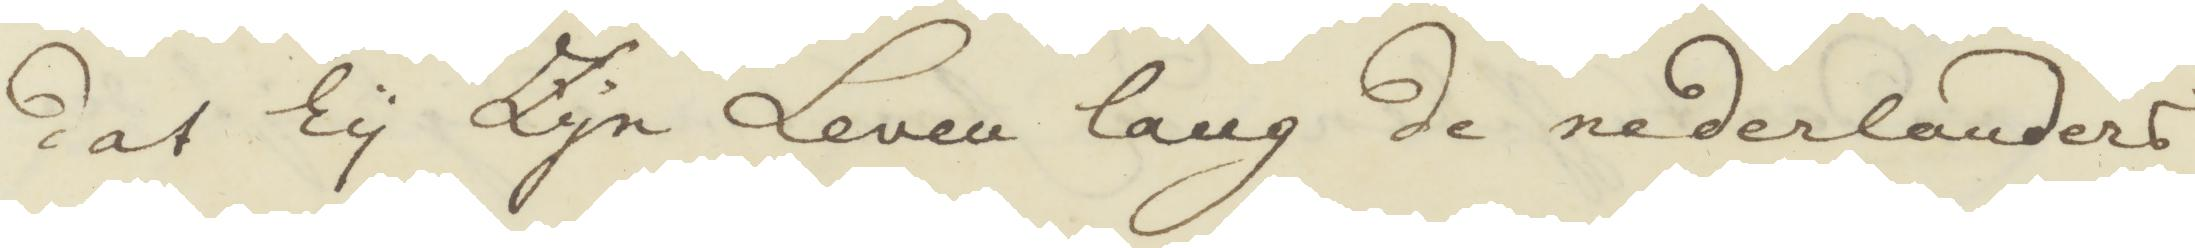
dat hij zijn Leven lang de nederlanders
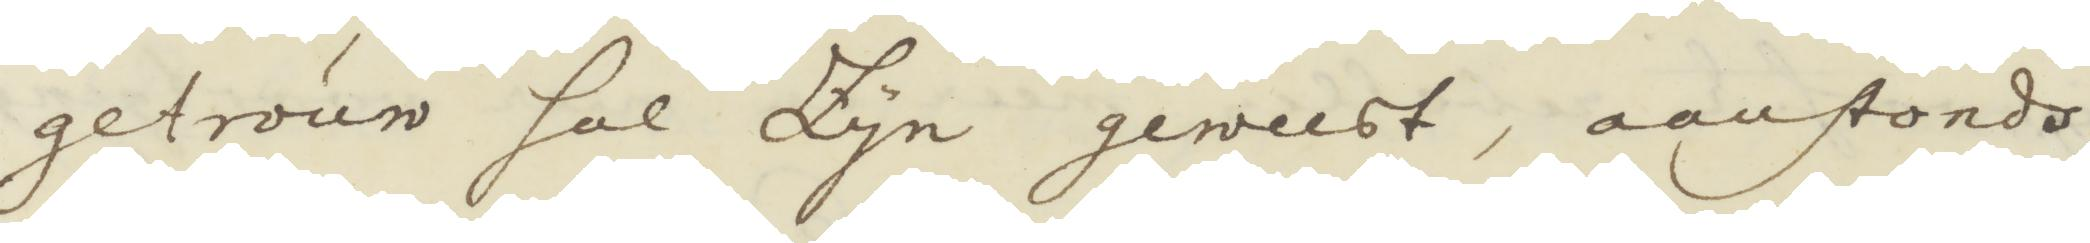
getrouw sal zijn geweest, aanstonds
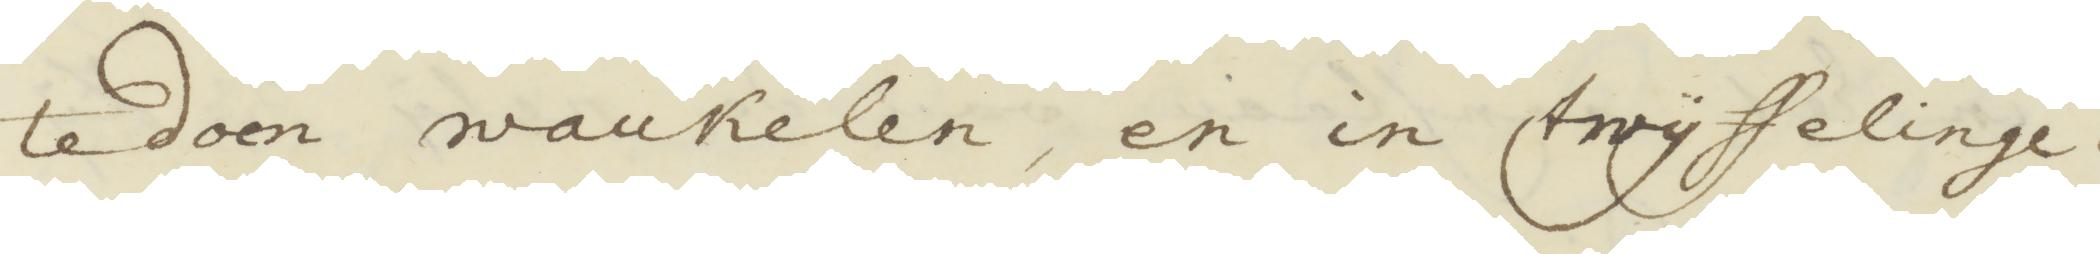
te doen wankelen, en in twijffelinge
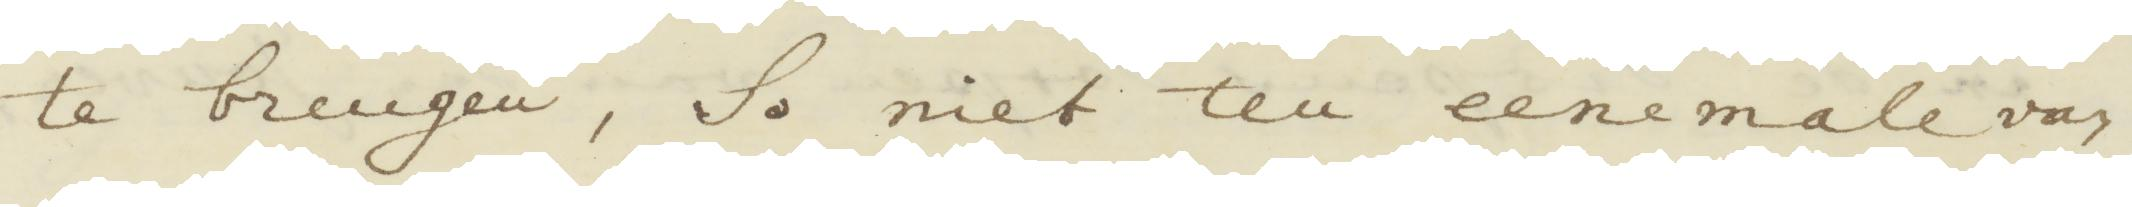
te brengen, so niet ten eene male van
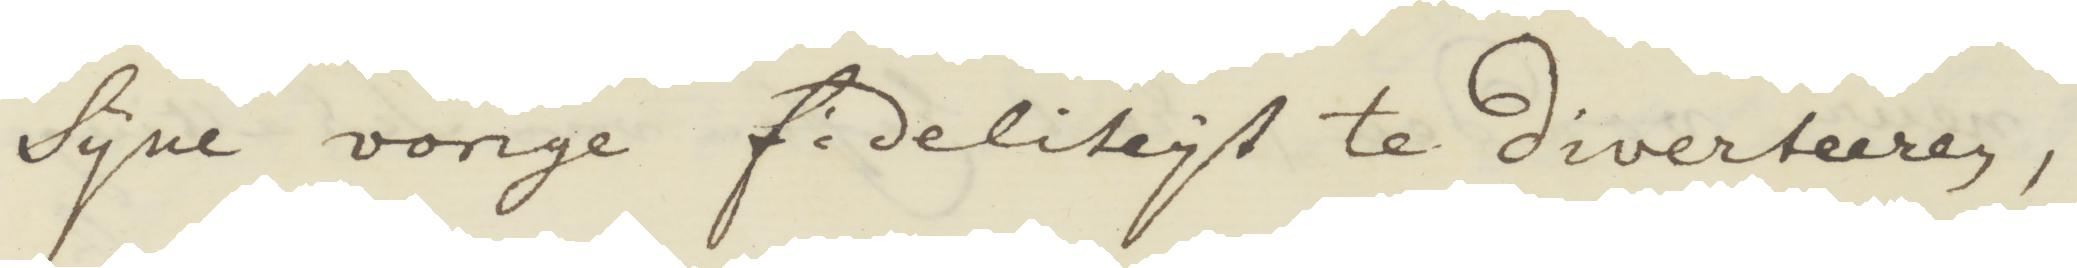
sijne vorige fideliteijt te diverteeren,
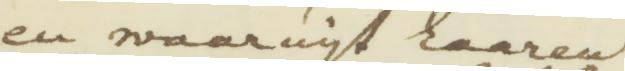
en waaruijt haaren
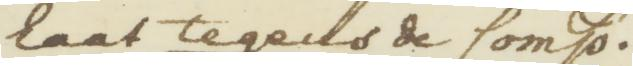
haat tegens de Comp.
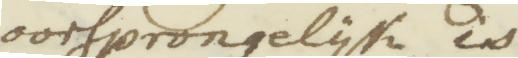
oorsprongelijk is
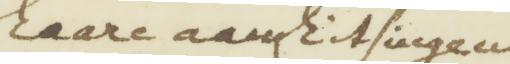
haare aanhitsingen
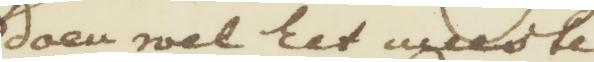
doen wel het meeste
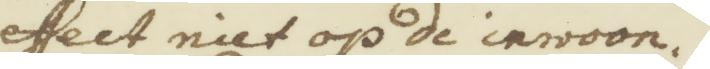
effect niet op de inwoon„
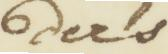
ders
